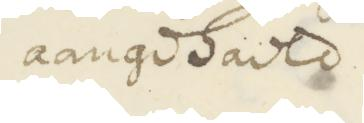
aangehaeld.
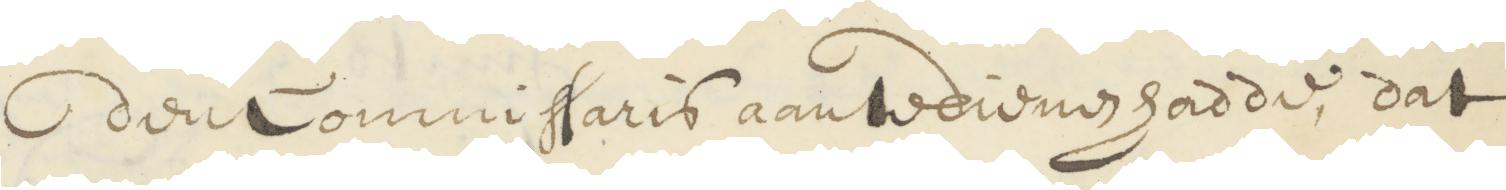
den Commissaris aan te dienen hadde, dat
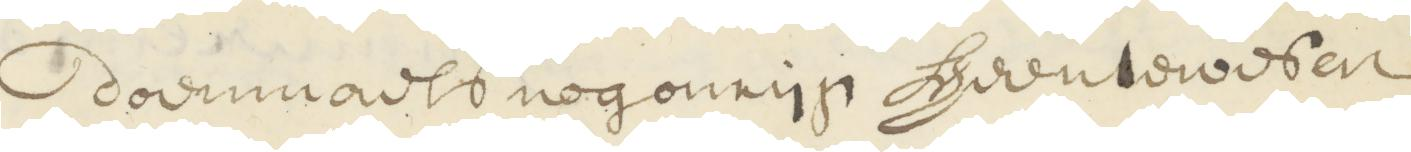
doenmaels nog onrijp scheen tewesen,
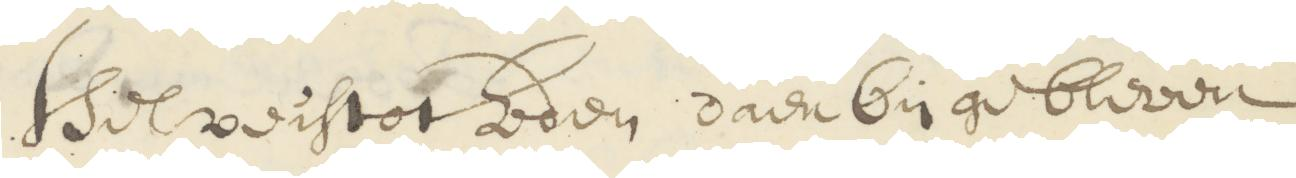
tselve is tot heden daer bij gebleven
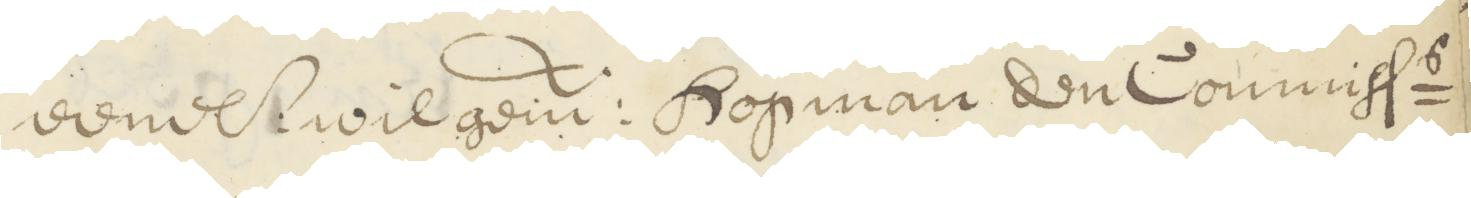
eenelijk wil gem: hopman den Commiss=s
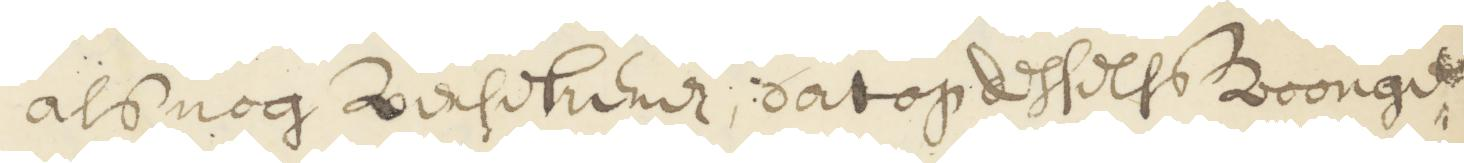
als nog versekeren; dat op desselfs voorge„
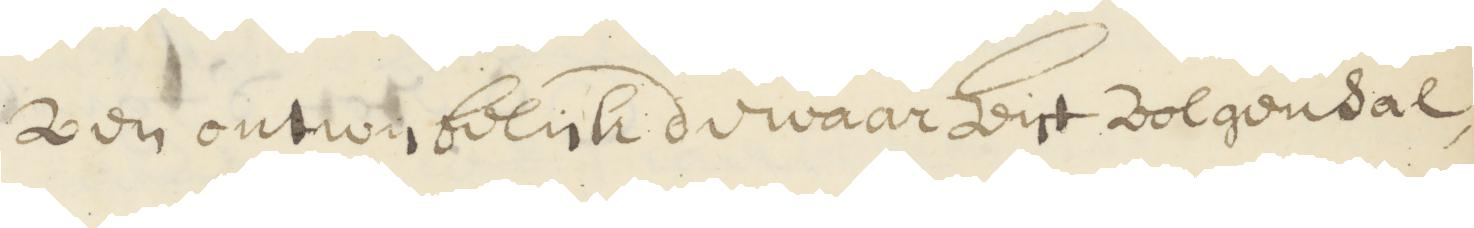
ven ontwijfelijk de waarheijt volgen sal,
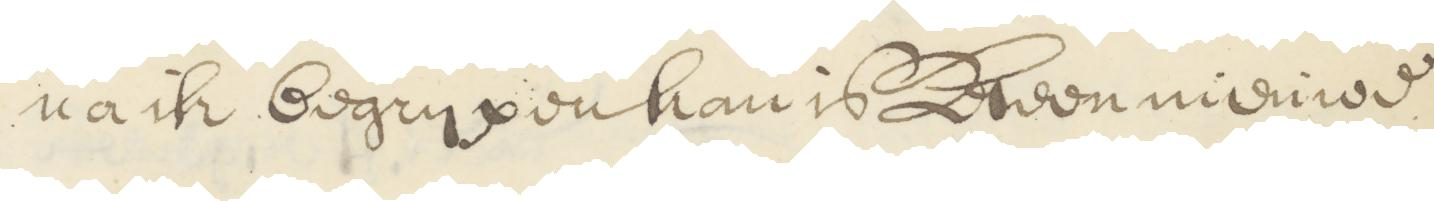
na ik begrijpen kan is het een nieuwe
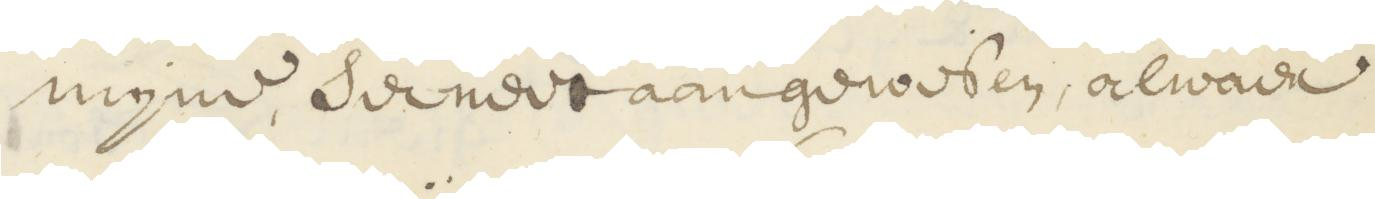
mijne, secreet aan gewesen, alwaer
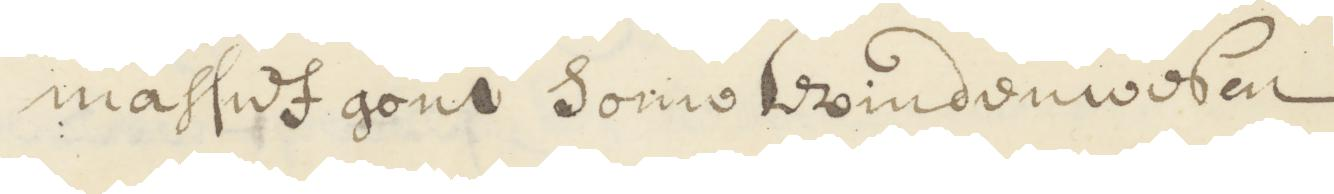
massief gout souw tevindenwesen.
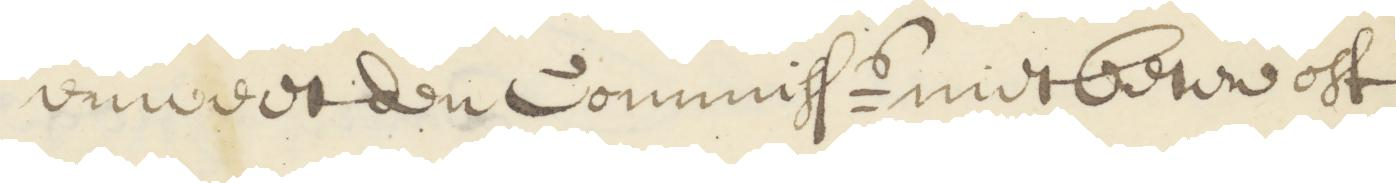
enweet den Commiss=s niet beter off
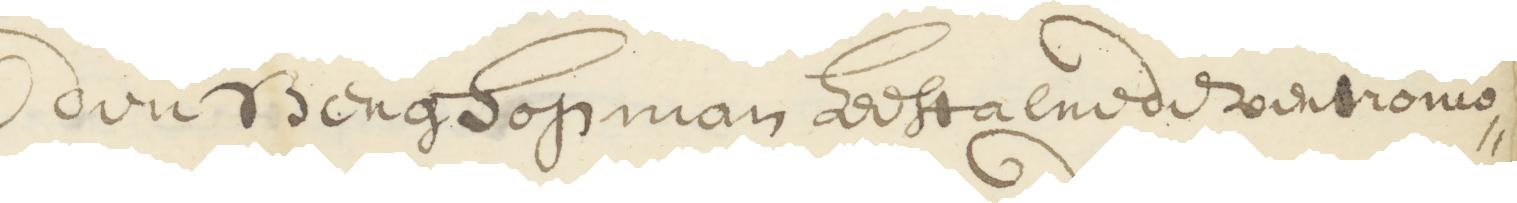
den Bergehopman heeft almede vertrouw„
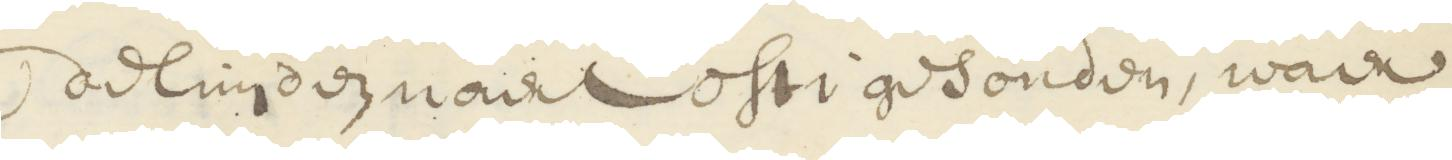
deluijden naer Costi gesonden, waer
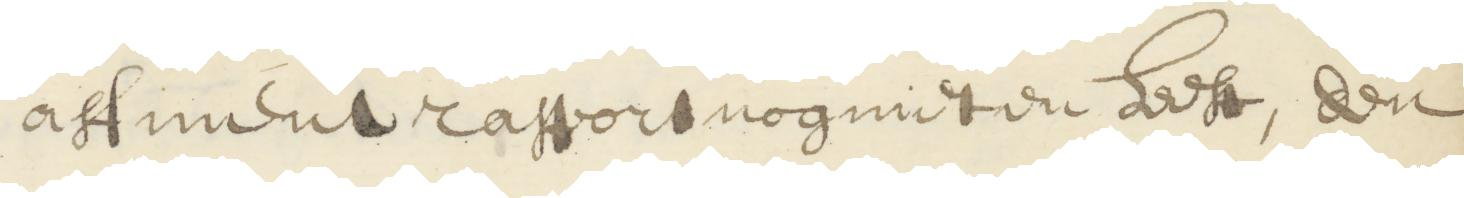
aff men 't rapport nog niet en heeft, den
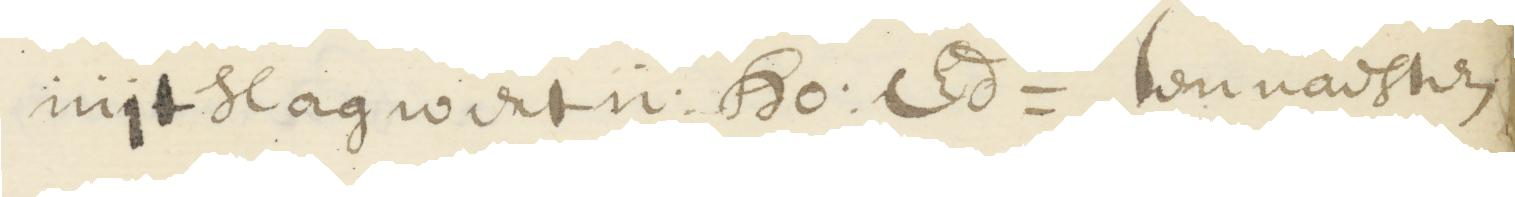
uijtslag wert u: Ho: Ed=ns ten naesten
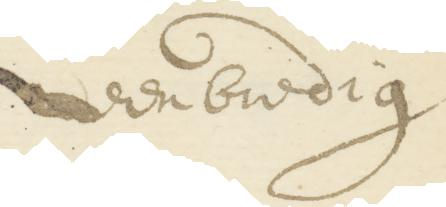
eerbiedig
